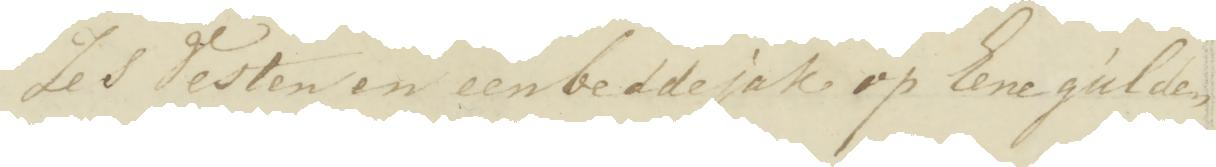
Zes Vesten en een beddejak op Eene gulden
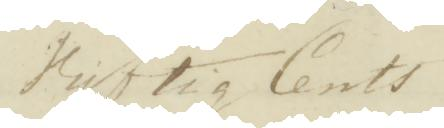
Vijftig Cents . . . . . . . „ 1 „ 50
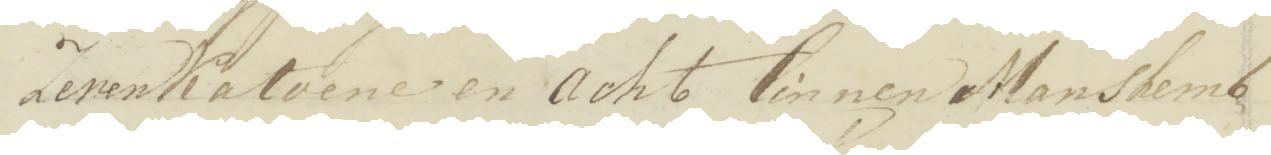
Zeven Katoene en acht linnen Manshemb
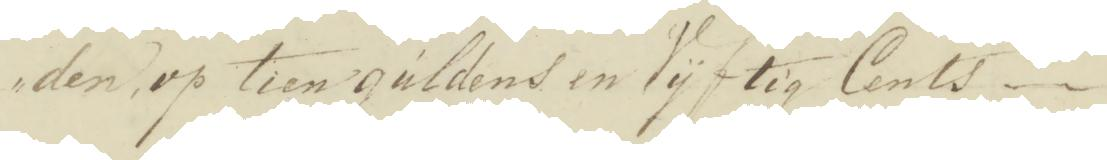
„den, op tien guldens en Vijftig Cents . . „ 10 50
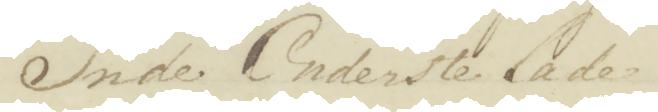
Jn de Onderste lade
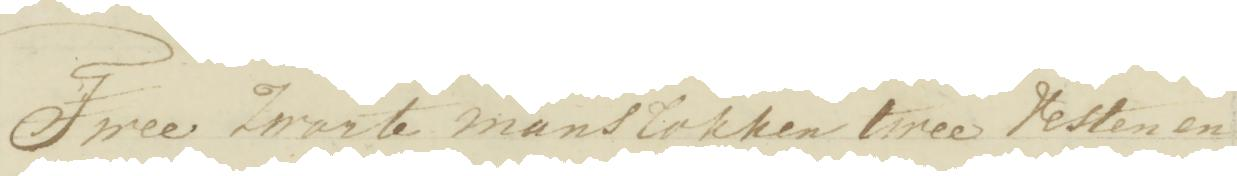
Twee zwarte mansrokken twee vesten en
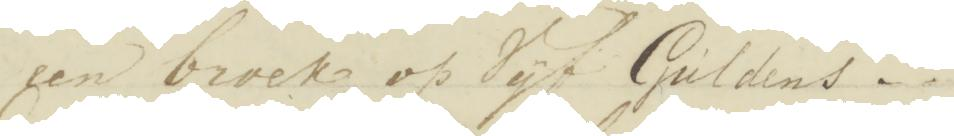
een broek op Vfij Guldens . . . . „ 5 „ —
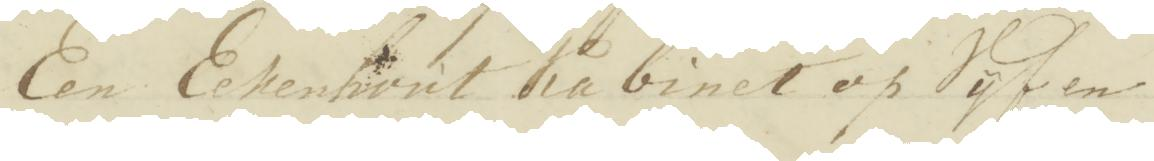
Een Eekenhout kabinet op Vijf en
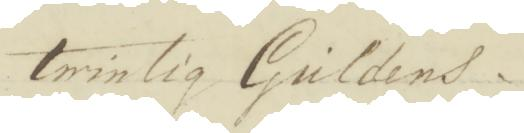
twintig Guldens . . . . . . . „ 25 „
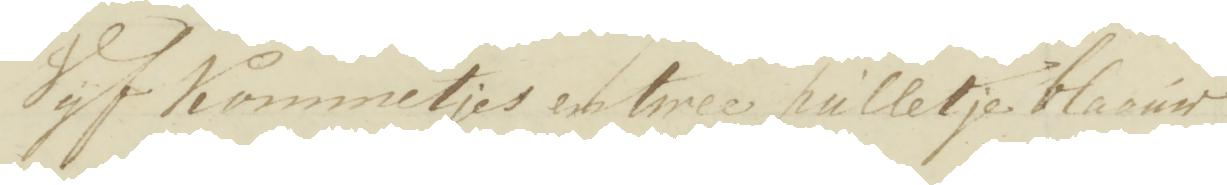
Vijf Kommetjes en twee pulletje blaauw
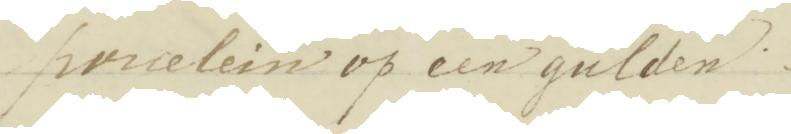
porcelein op een gulden . . . . „ 1
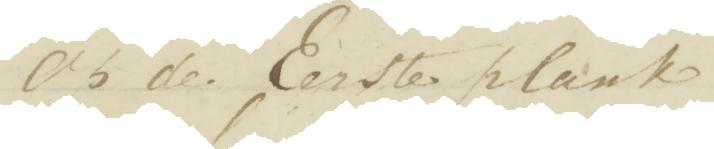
Op de Eerste plank
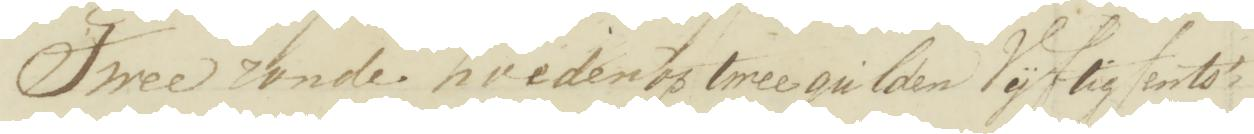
Twee ronde hoeden op twee gulden Vijftig Cents „ 2 - 50
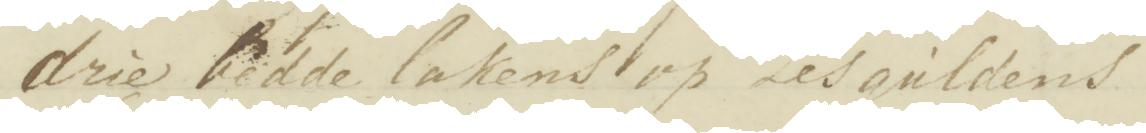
drie bedde lakens op Zes guldens „ 6 „ —
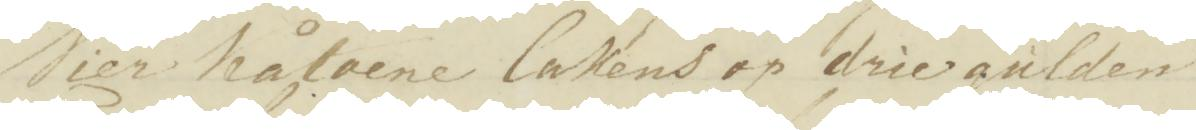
Vier Katoene lakens op drie gulden „ 3 „ —
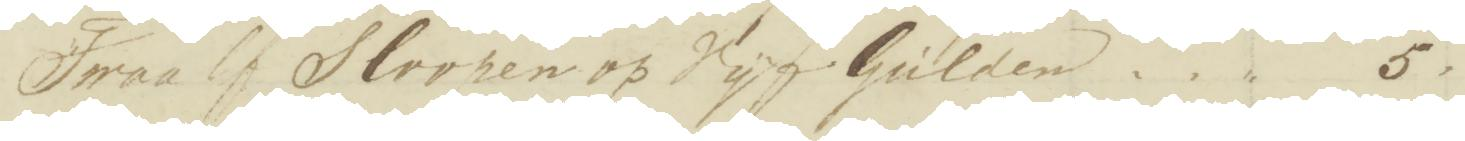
Twaalf Sloopen op Vijf Gulden . . „ 5 „ —
